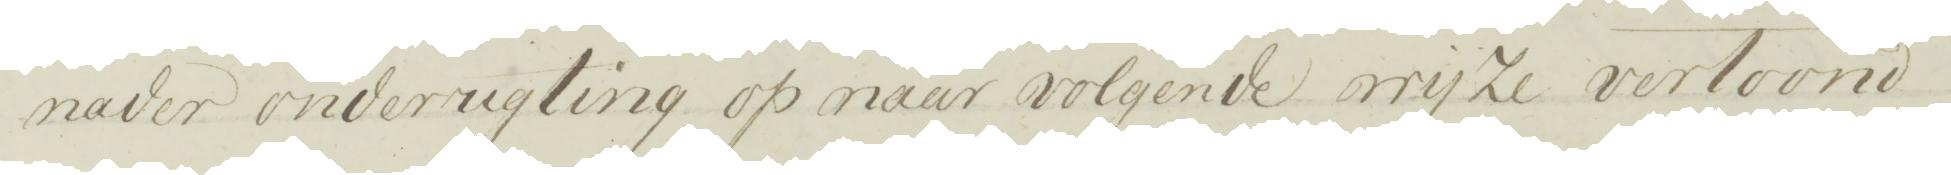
nader onderrigting op naar volgende wijze vertoond
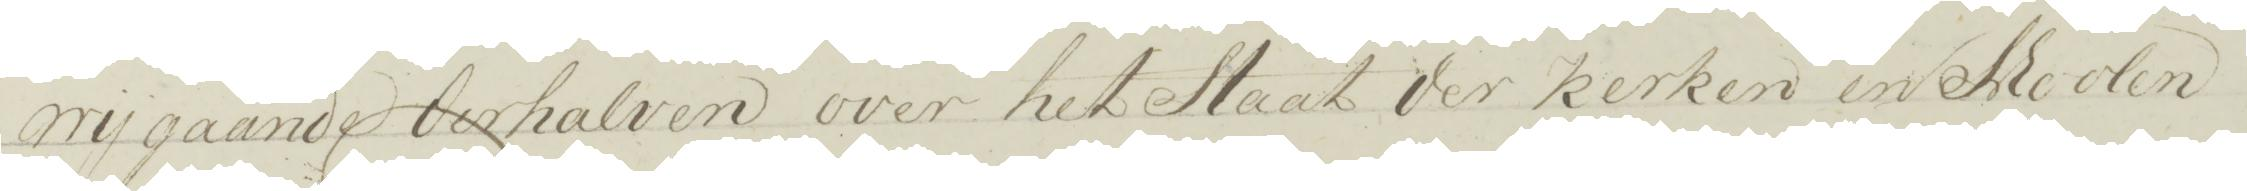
wij gaande derhalven over het staat der kerken en schoolen
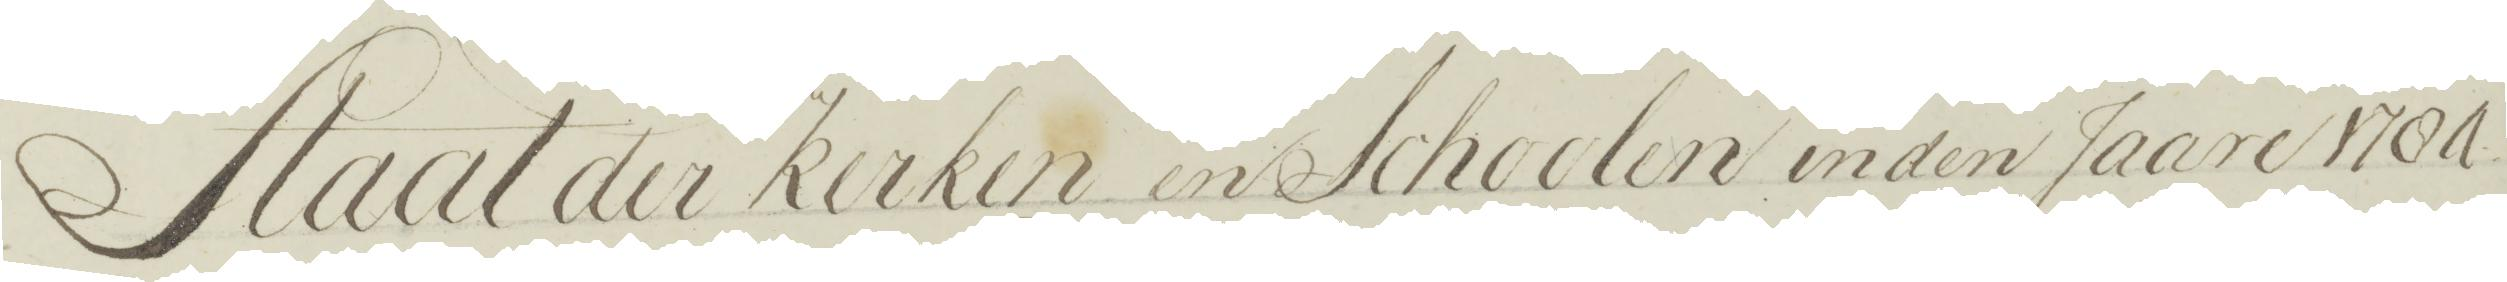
Staat der kerken en Schoolen in den Jaare 1784
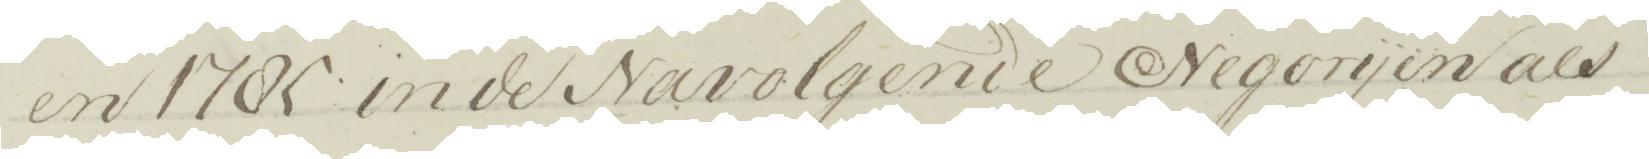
en 1785 in de Navolgende Negorijen als
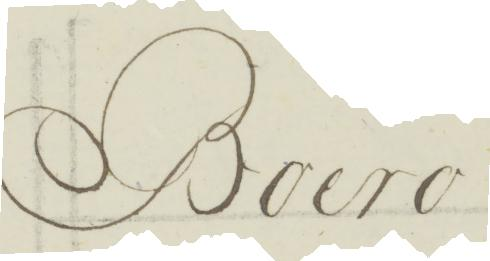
Boero
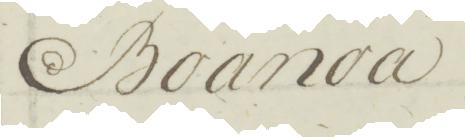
Boanoa
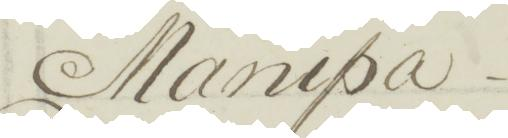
Manipa
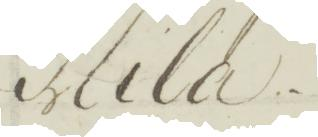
Hila
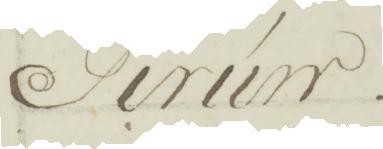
Piruw
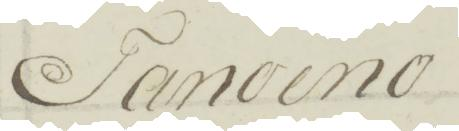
Tanoeno
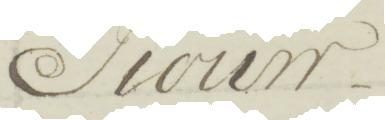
Tiouw
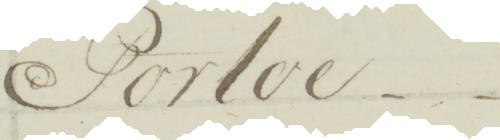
Portoe
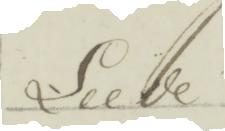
Leede
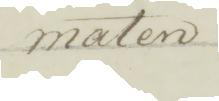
maten
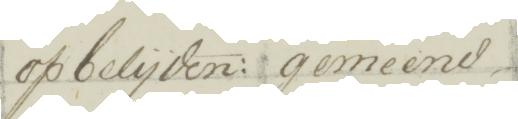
op belijden: gemeend
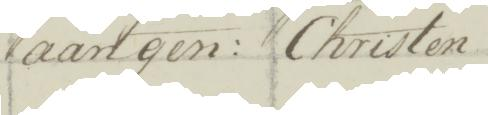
aan gen: Christen
